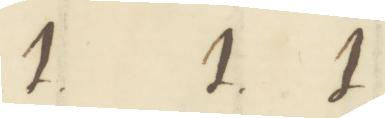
1. 1. 1
